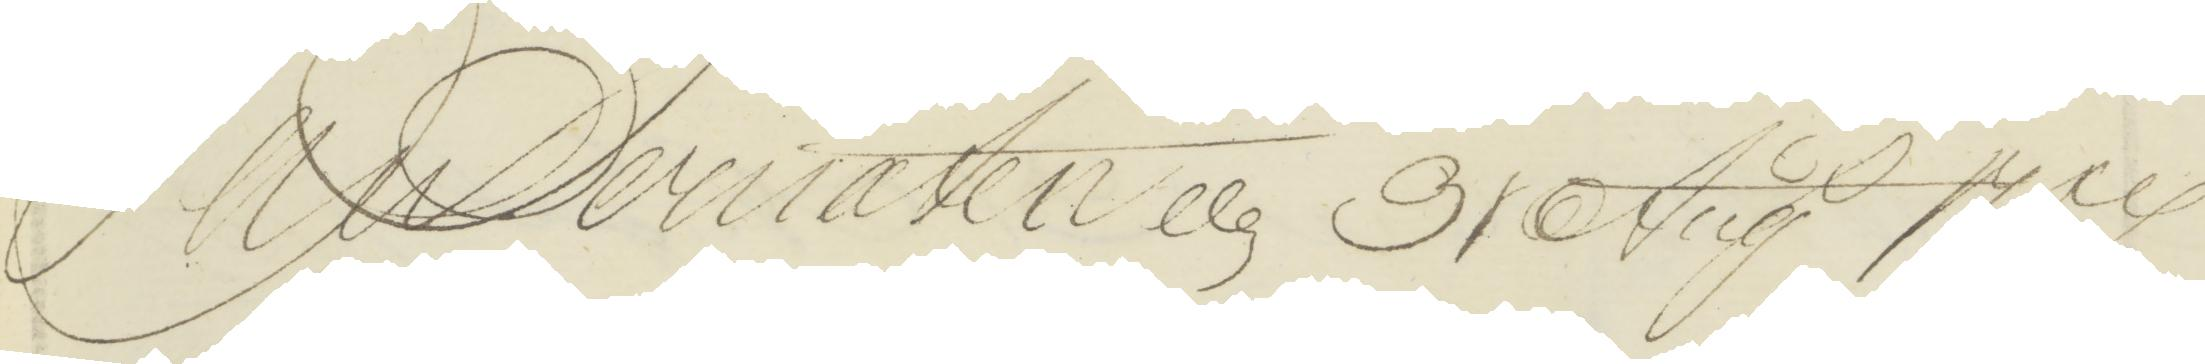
Van Ternaten den 31 Augs 1757
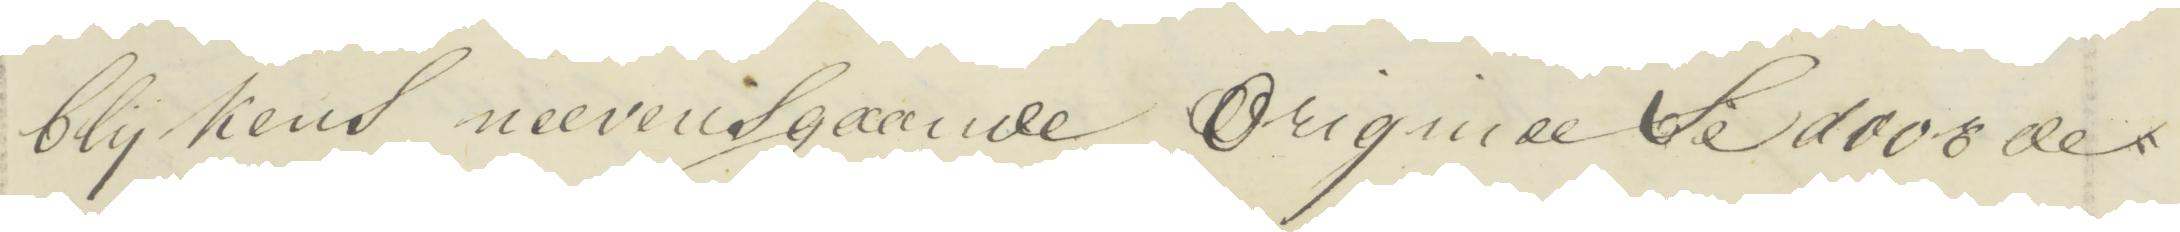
blijkens neevensgaande Origineele door de
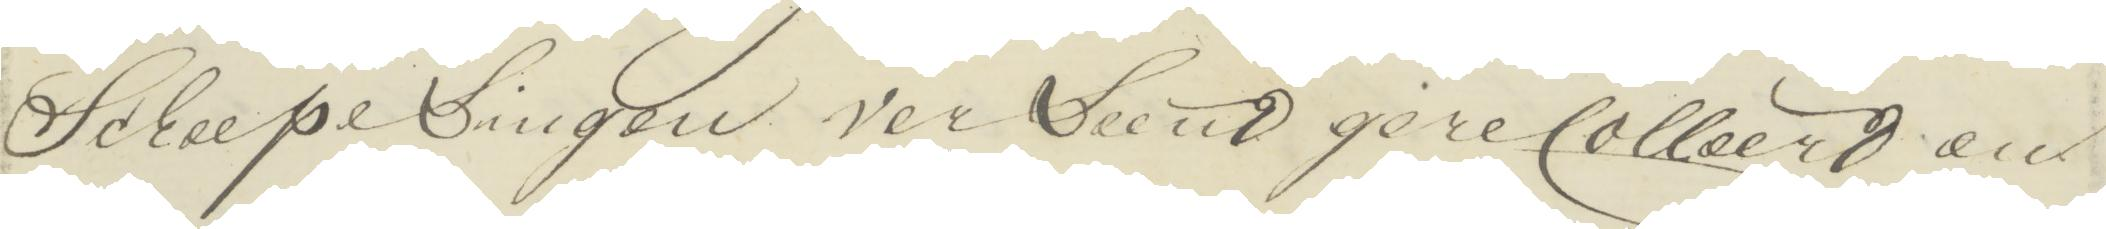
scheepelingen verleend gerecolleerd en
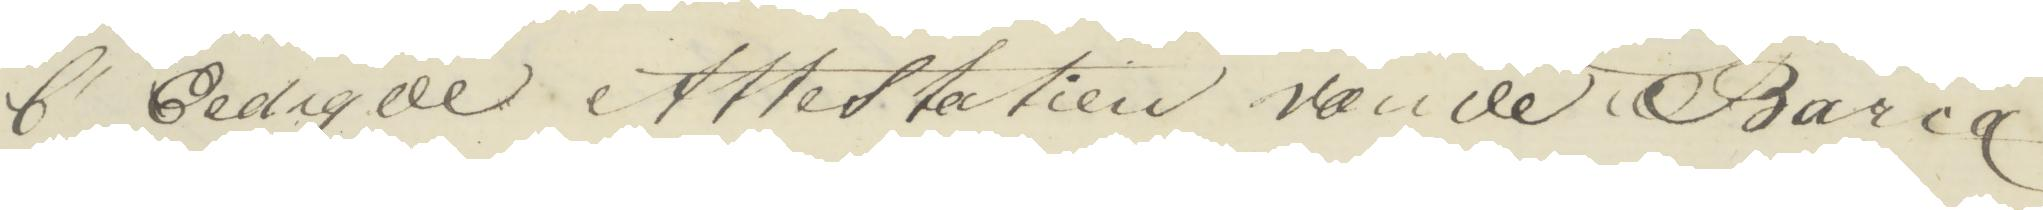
b' Eedigde Attestatien van de Barcq
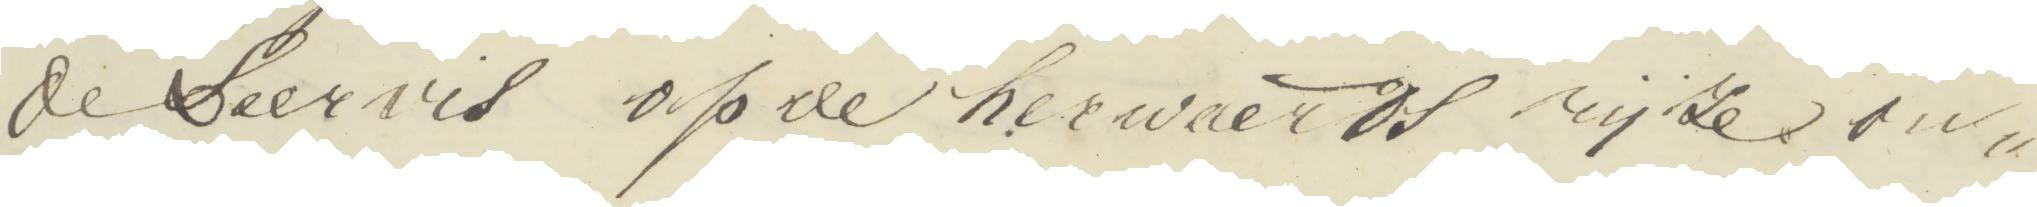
de Leervis opde herwaerds rijze on„
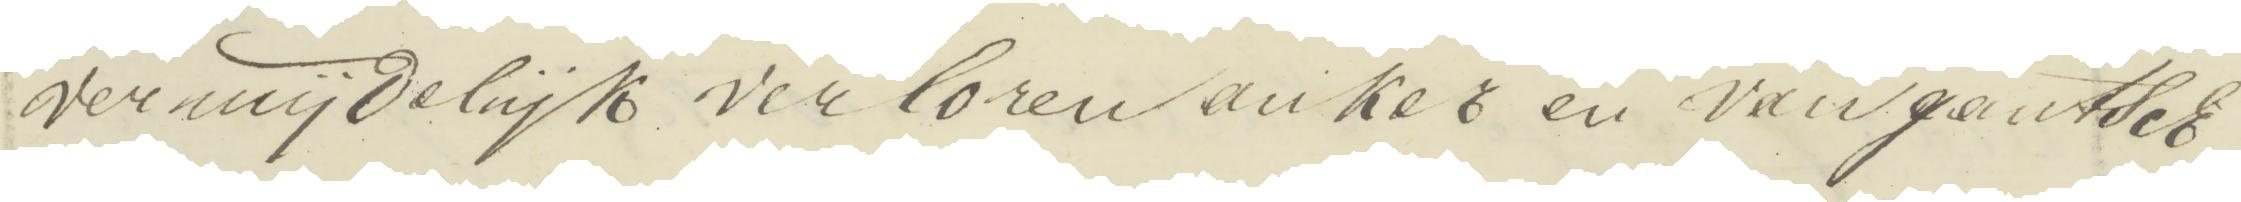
vermijdelijk verloren anker en van gantsch
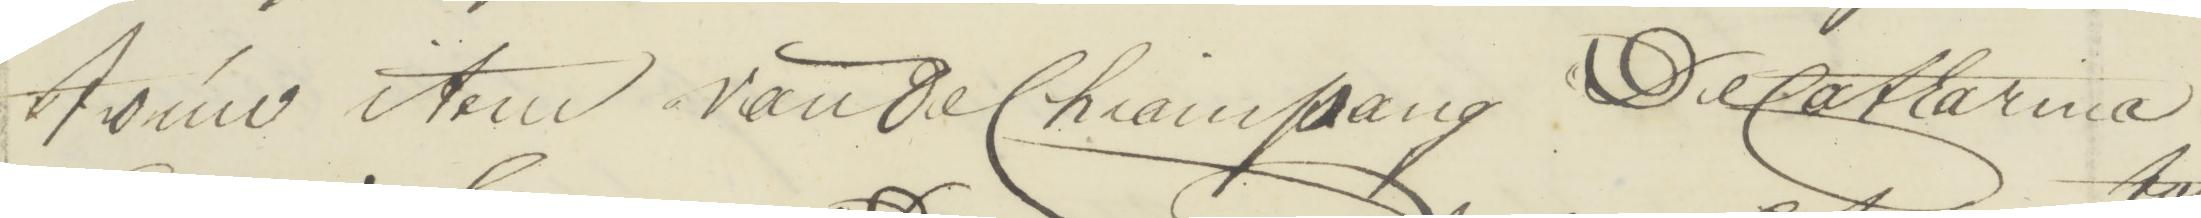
touw item van de Chiampang De Catharina
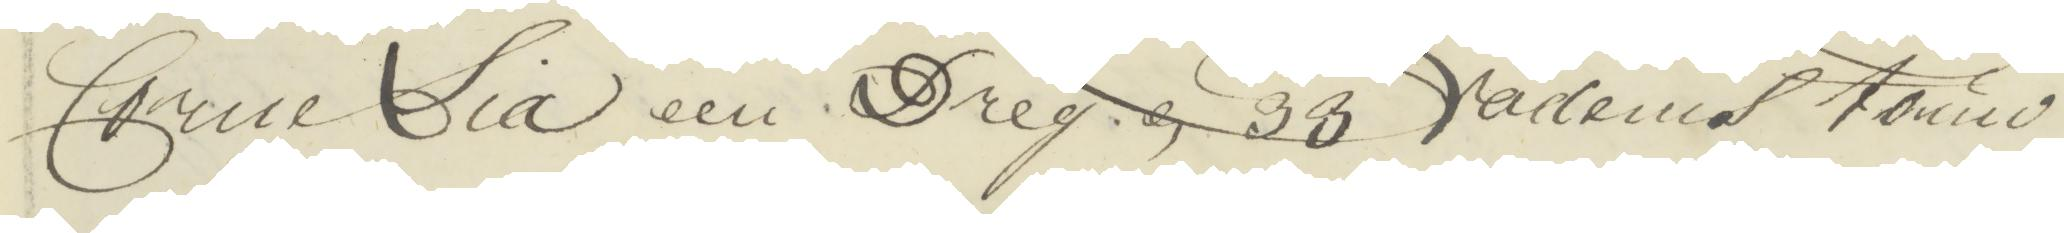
Cornelia een Dreg en 33 Vadems touw
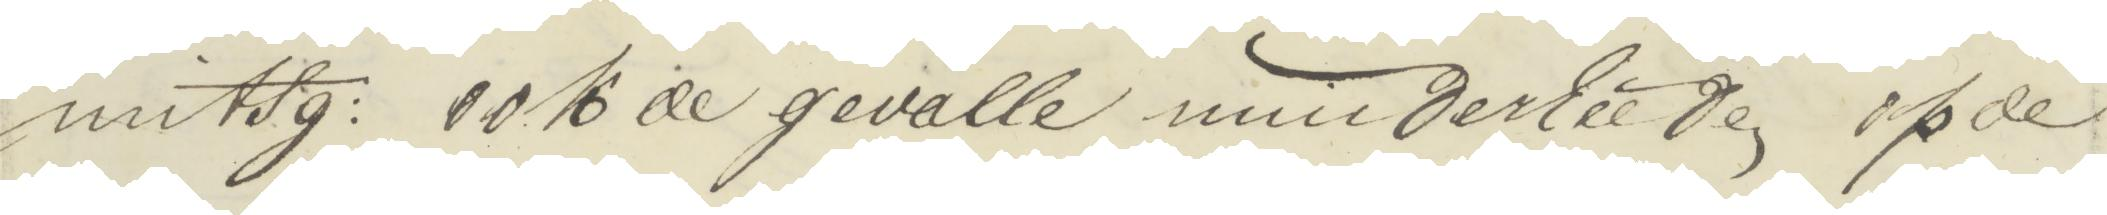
mitsg: ook de gevalle minderheeden op de
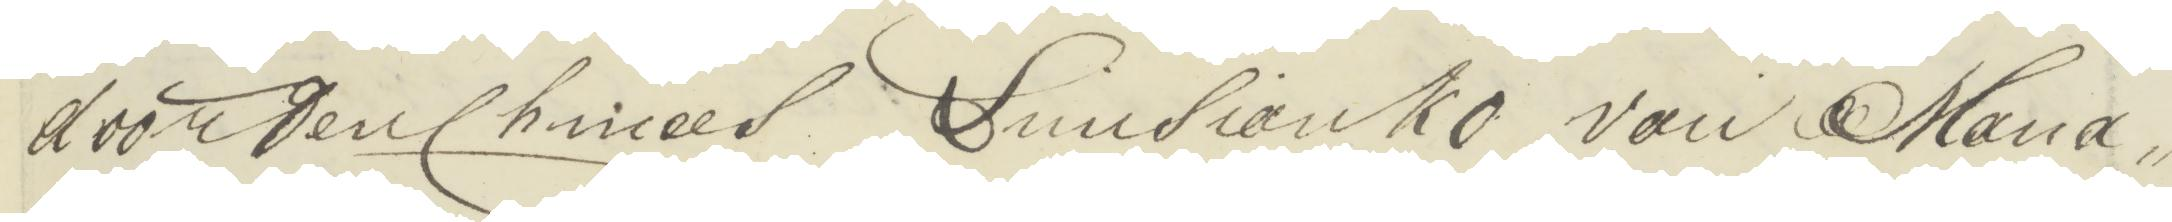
door den Chinees Limsianko van Mana„
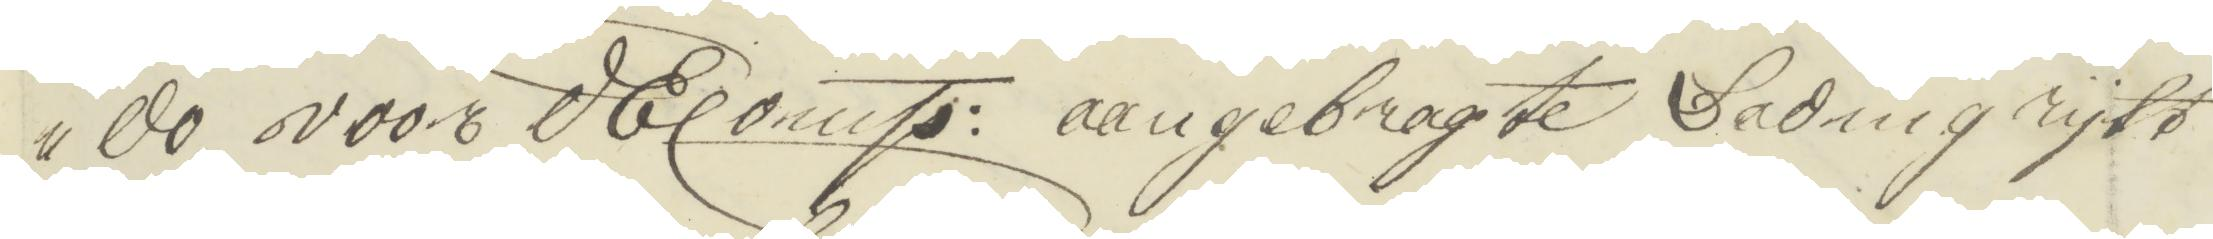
„do voor dEComp: aangebragte Lading rijst
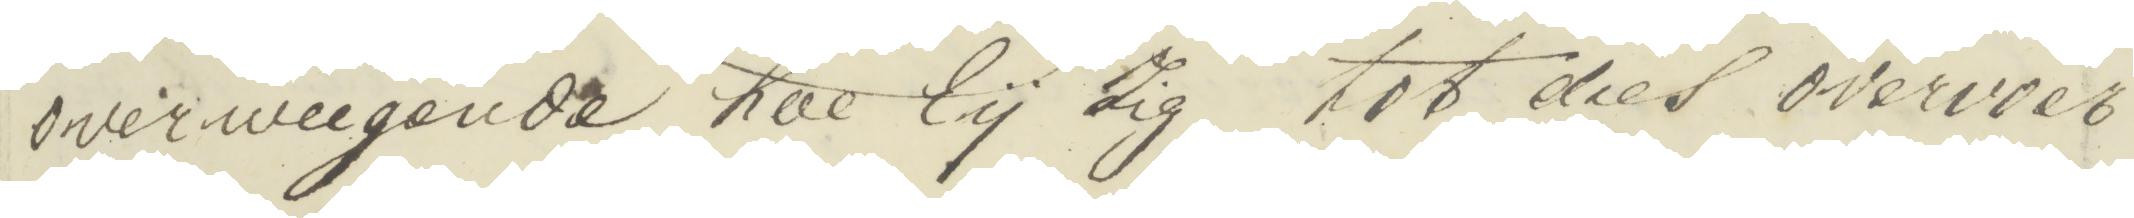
overweegende hoe hij zig tot dies overvoer
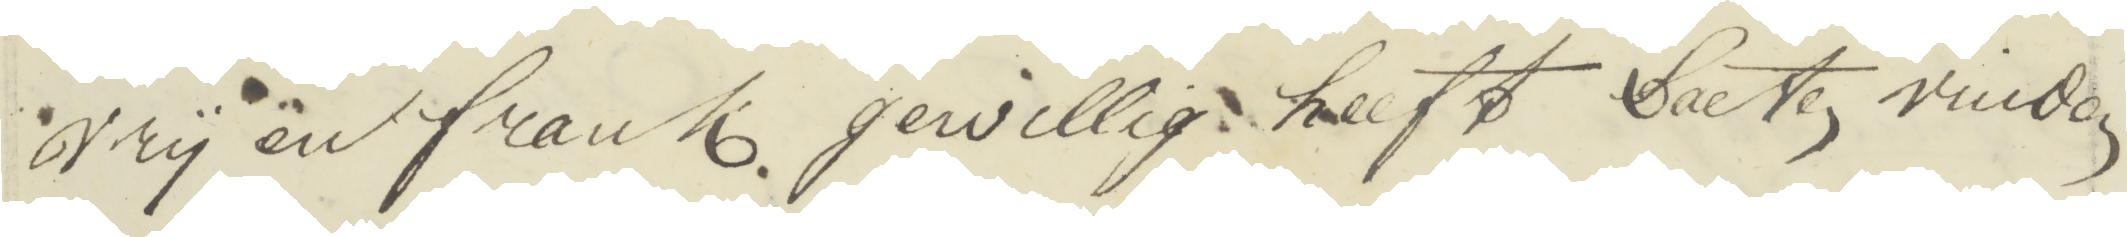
vrij en frank gewillig heeft Laeten vinden
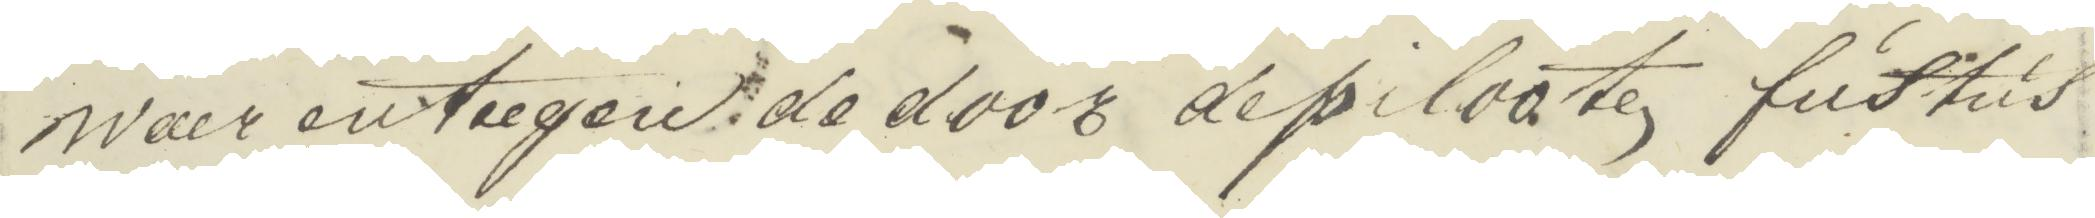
waer enteegen de door de pilooten fustus
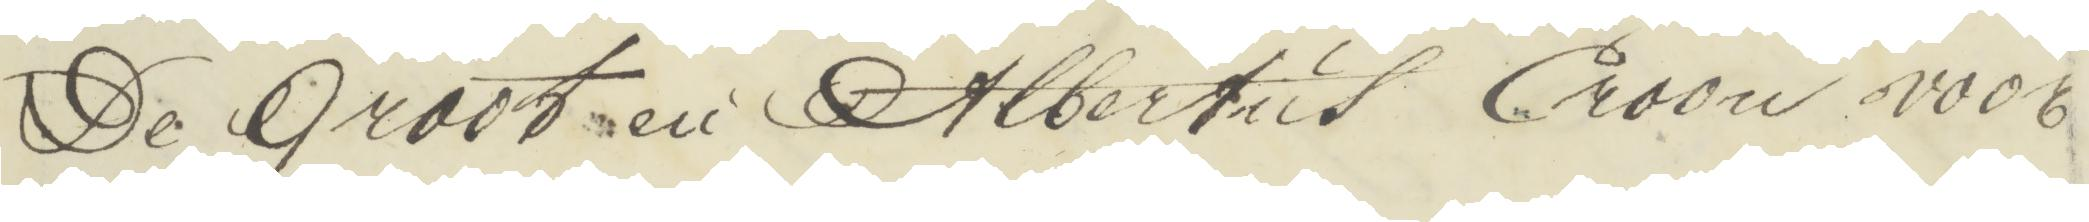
De Groot en Albertus Croon voor
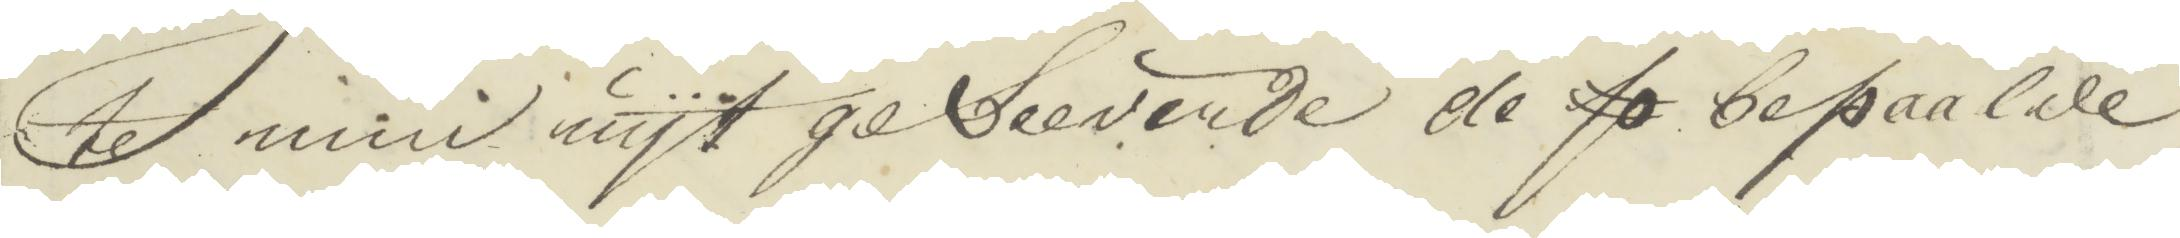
te min uijt geleeverde de p bepaalde
